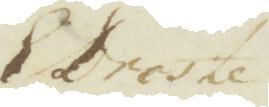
E Droste
